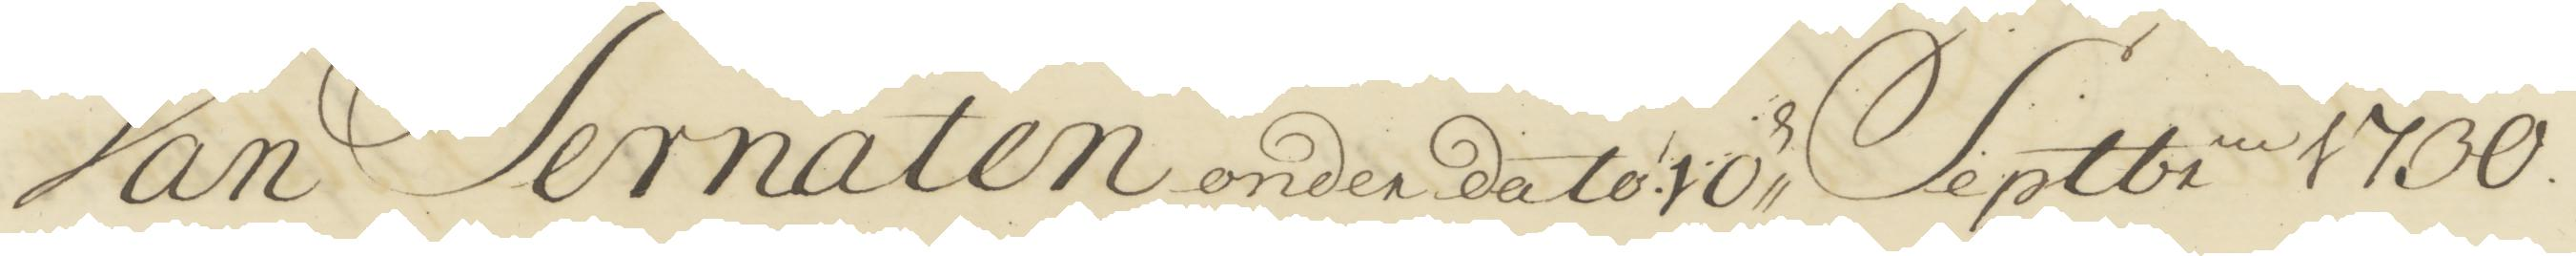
Van Ternaten onder dato 10„en Septbr:e 1730.
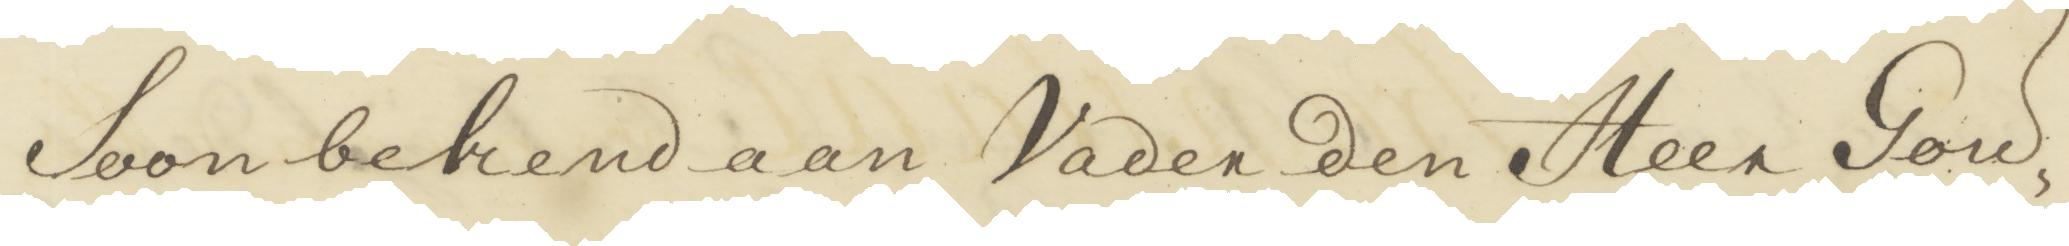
Soon bekend aan Vader den Heer Gou„
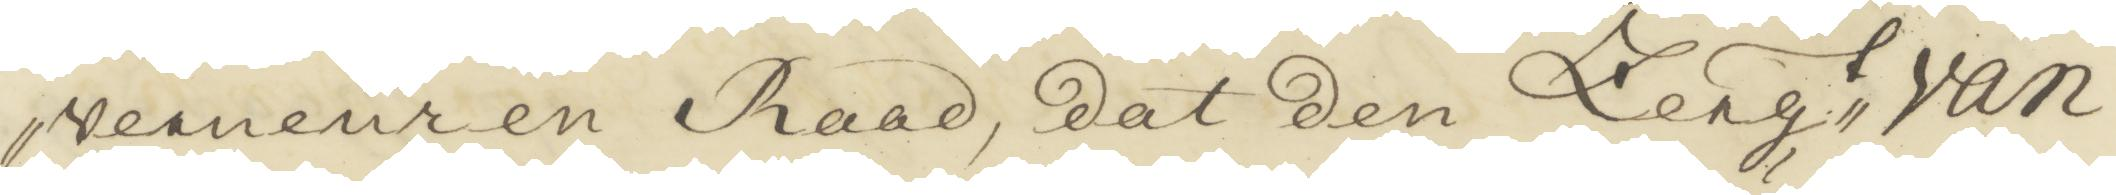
„verneur en Raad, dat den Zerg„t van
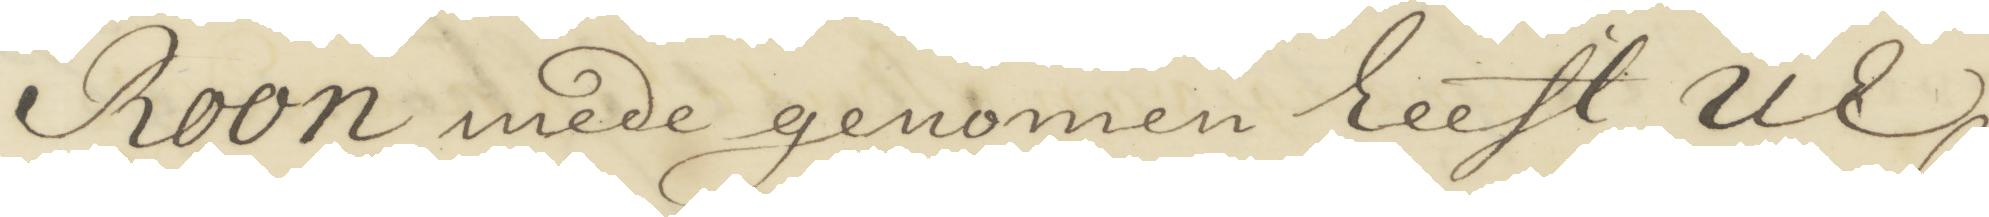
Roon mede genomen heeft UE
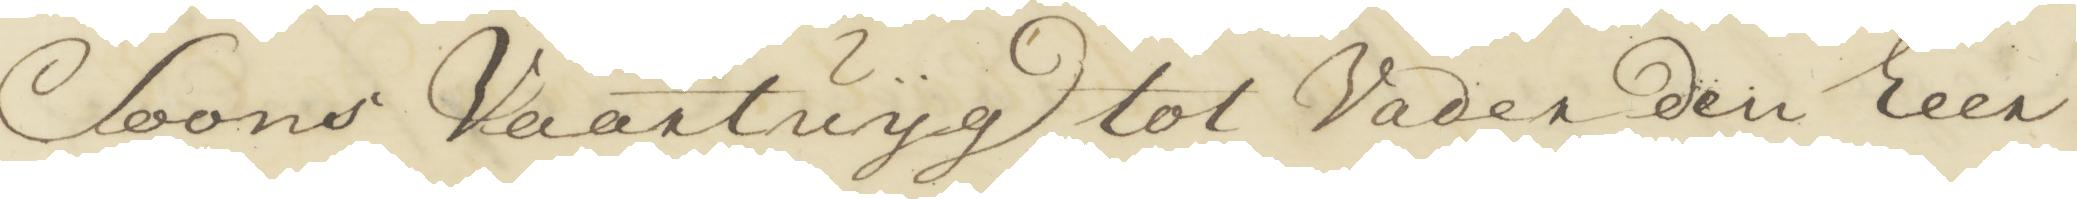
Soons Vaartuijg tot Vader den heer
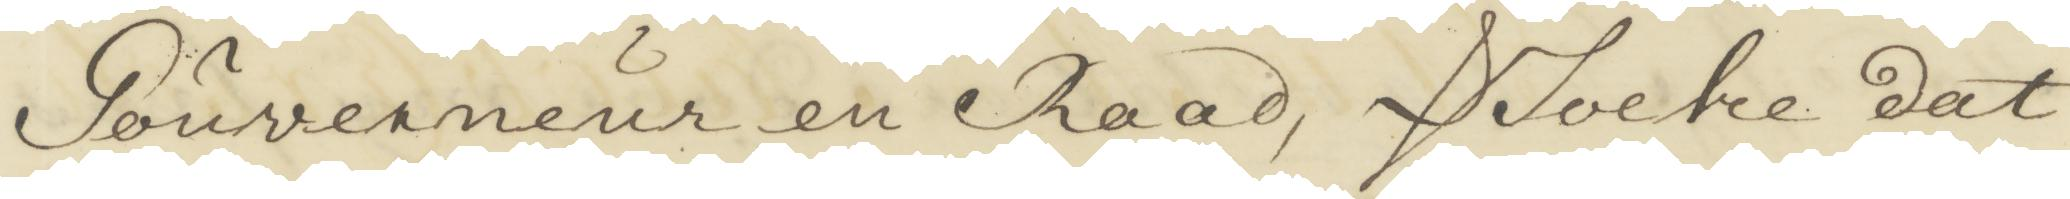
Gouverneur en Raad, Versoeke dat
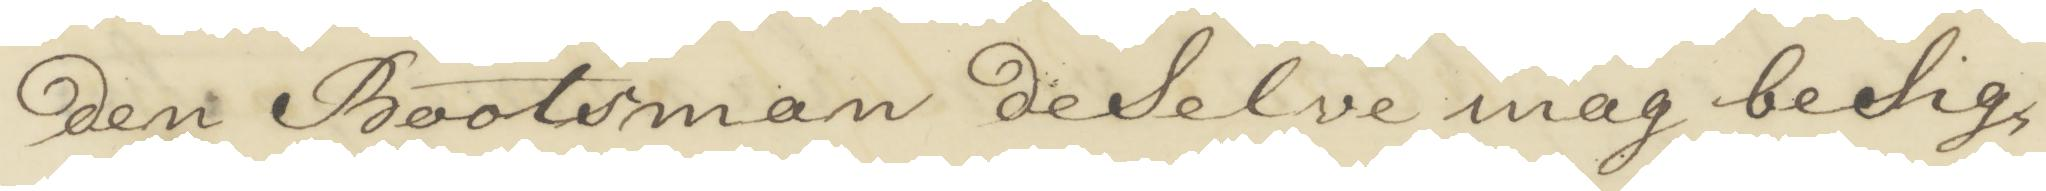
den Bootsman deselve mag besig„
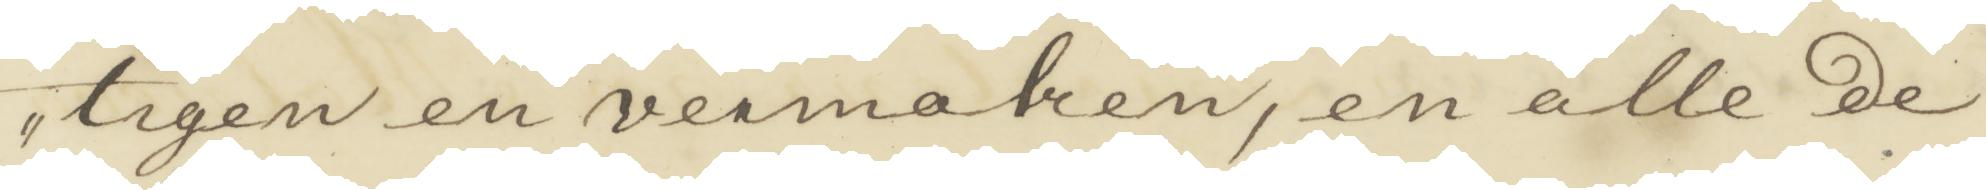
„tigen en vermaken, en alle de
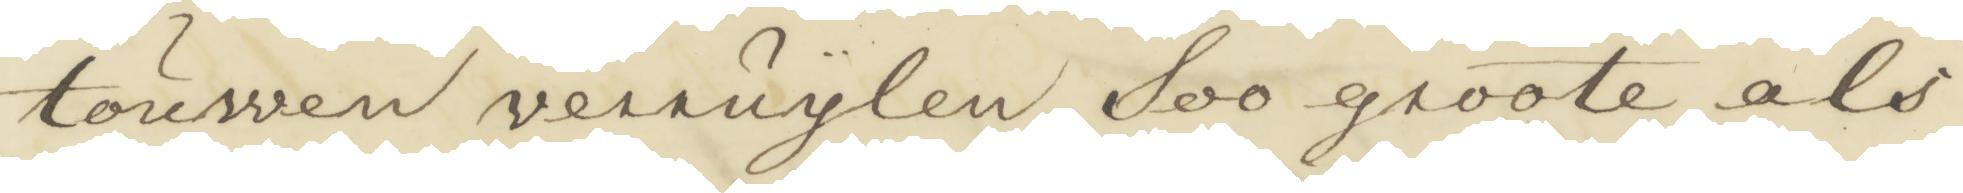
touwen verruijlen, Soo groote als
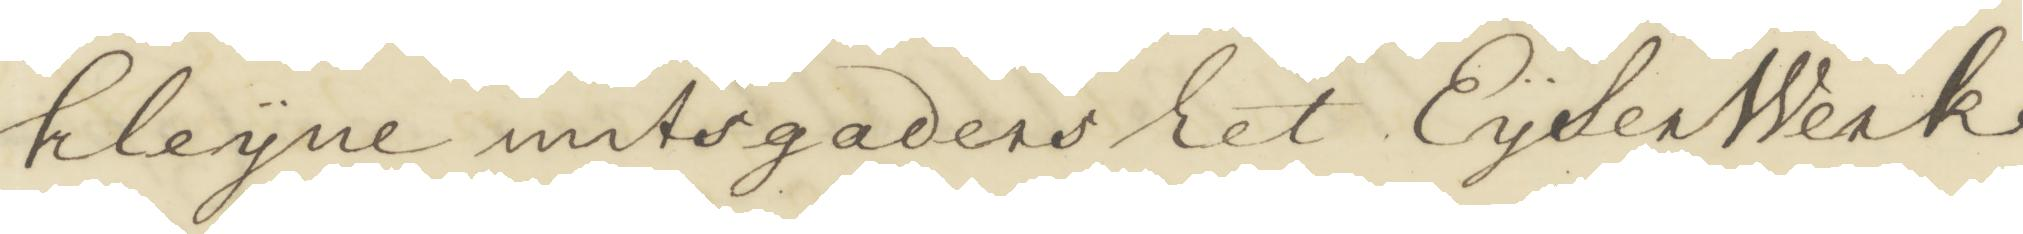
kleijne mitsgaders het Eijser Werk
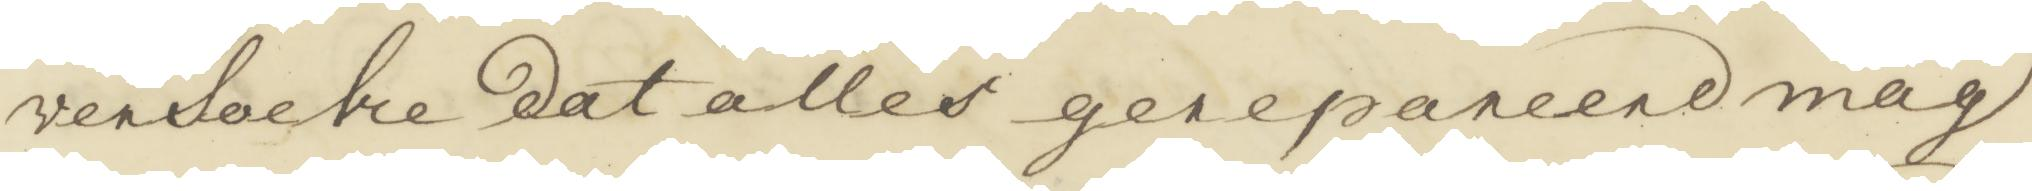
versoeke dat alles gerepareerd mag
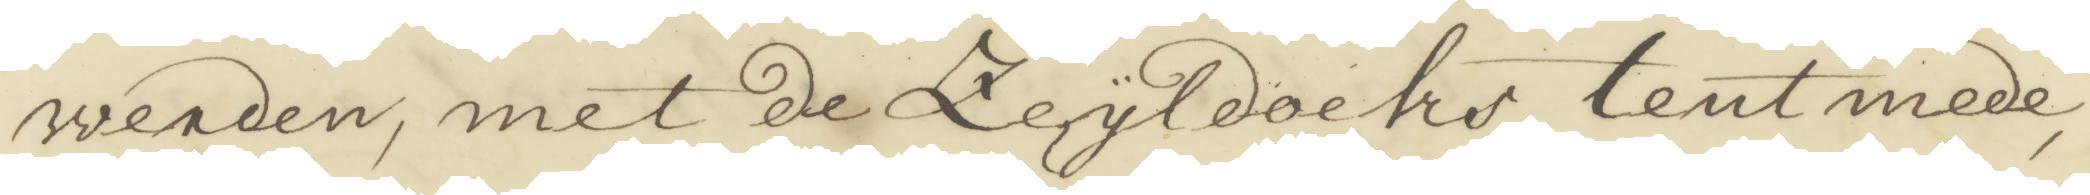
werden, met de Zeijldoeks tent mede,
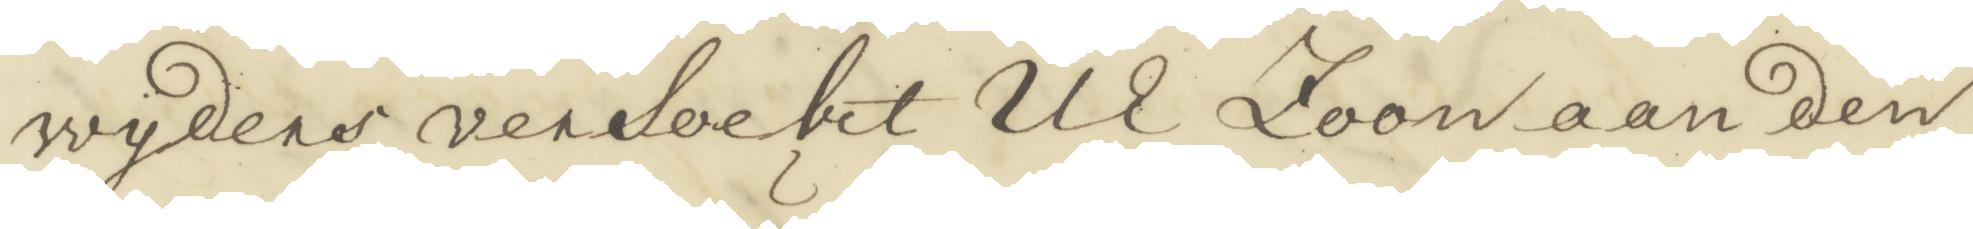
wijders versoekt UE Zoon aan den
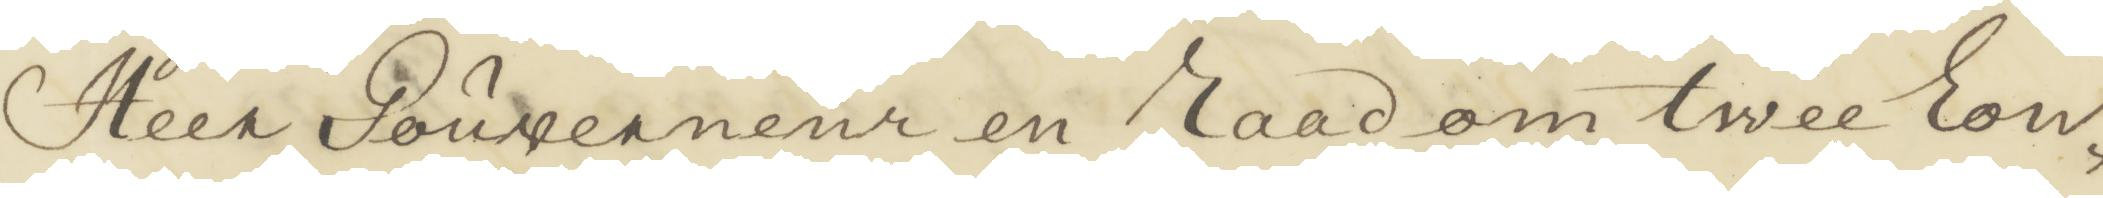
Heer Gouverneur en Raad om twee hon„
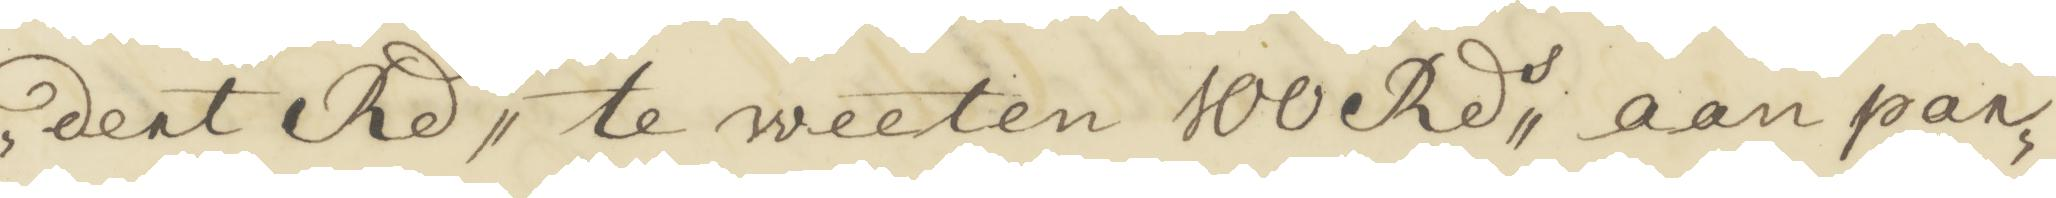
„dert Rd„s te weeten 100 Rd„s aan par„
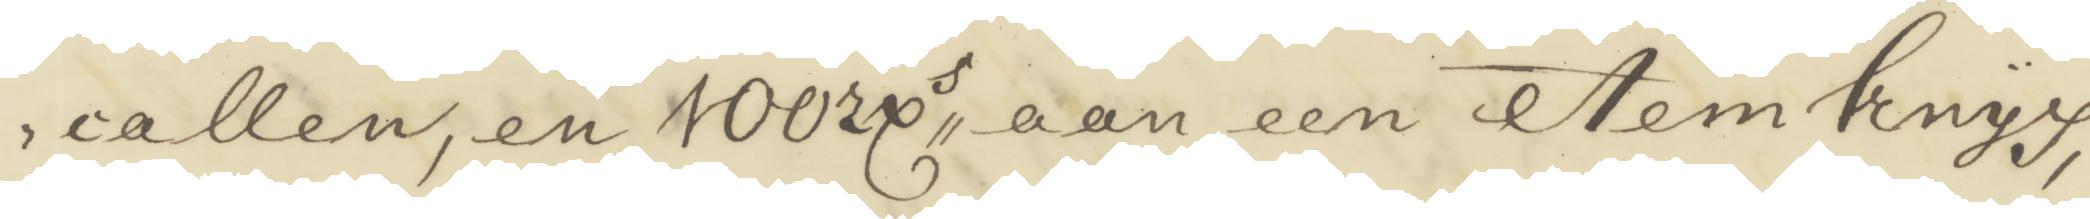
„callen, en 100 rx„s aan een etem knijs,
